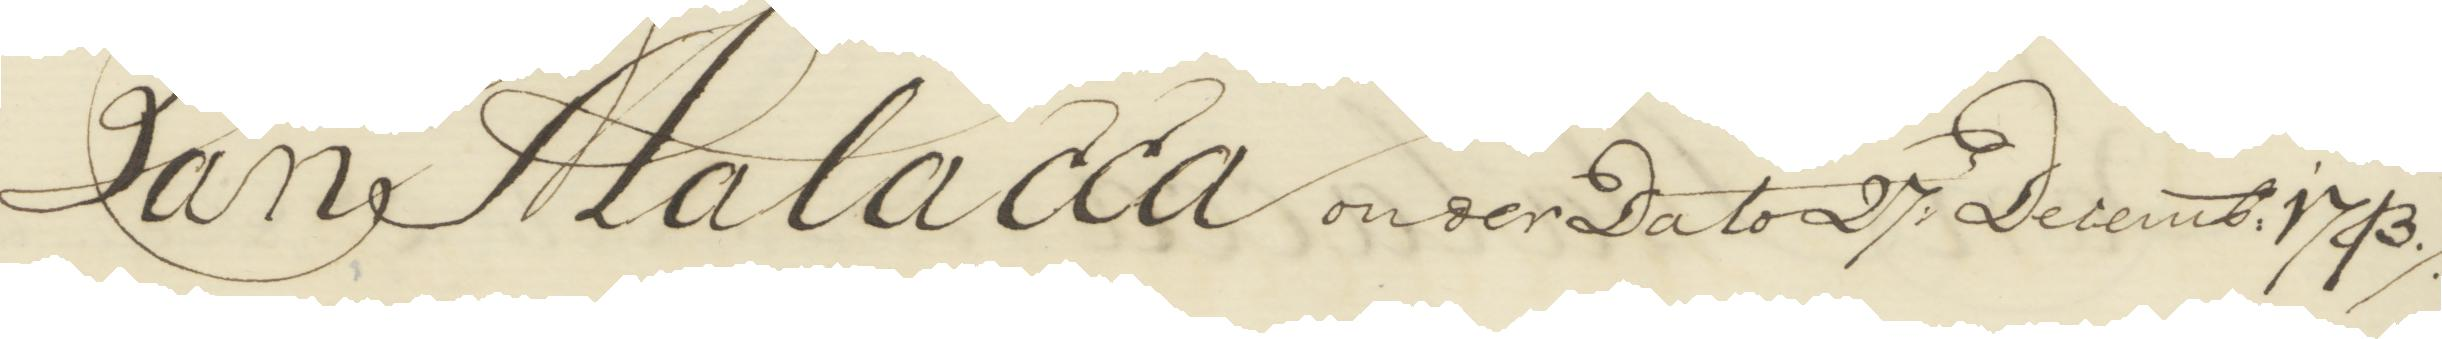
Van Malacca onder Dato 27:' Decemb: 1743./.
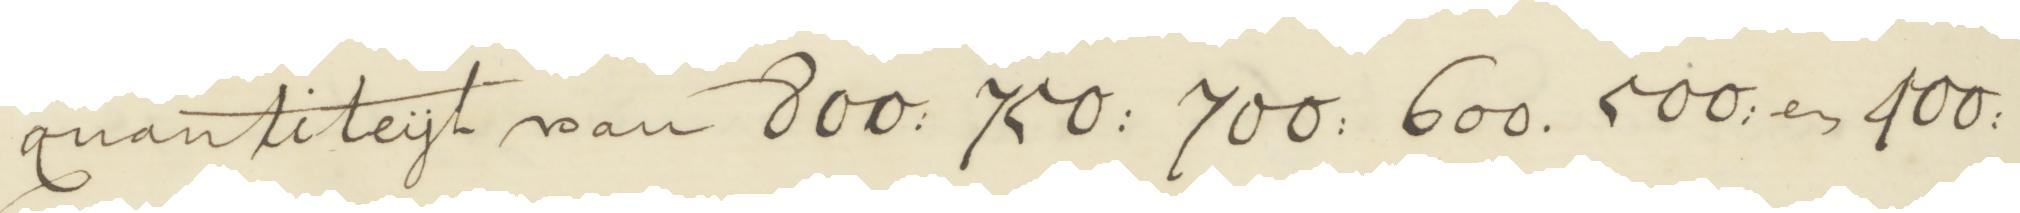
quantiteijt van 800: 750: 700: 600. 500: en 400:
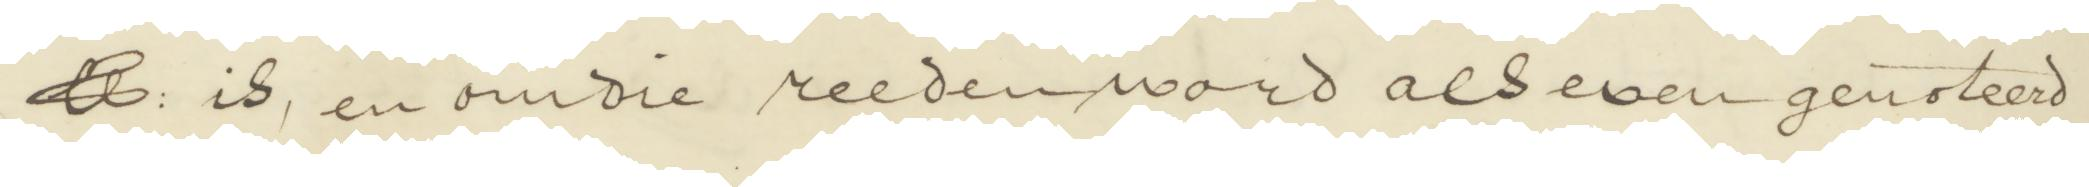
lb: is, en om die reeden word als even genoteerd
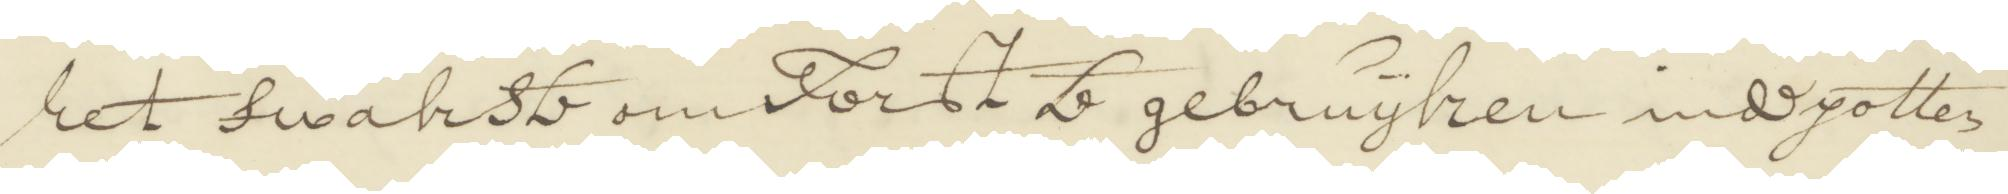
het swakste om Eerst te gebruijken in de potten
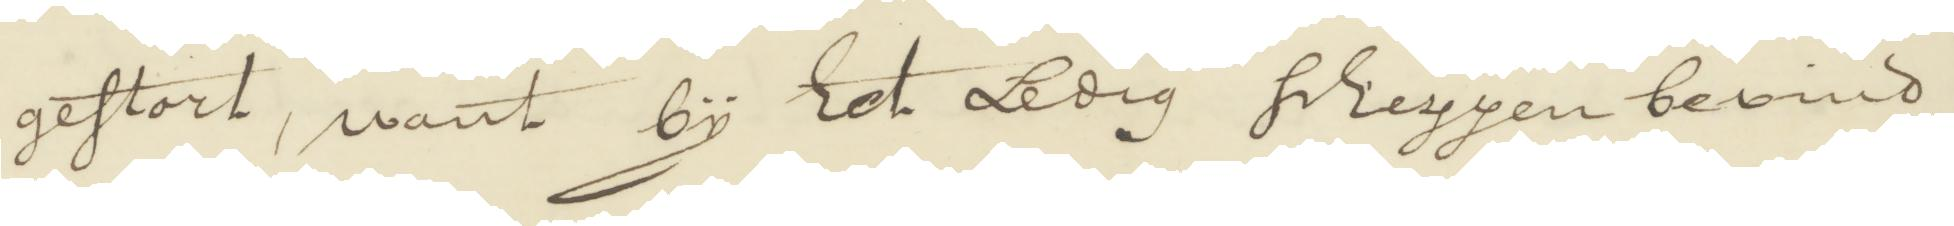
gestort, want bij het ledig scheppen bevind
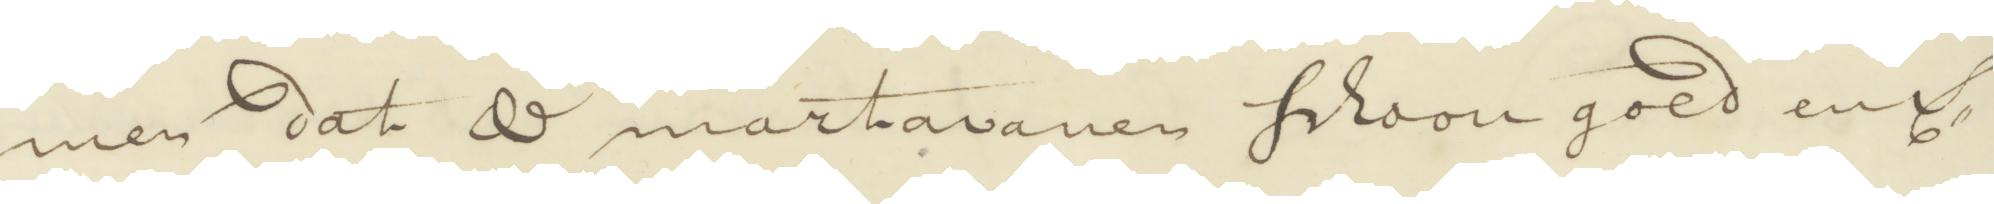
men dat de martavanen schoon goed en ver„
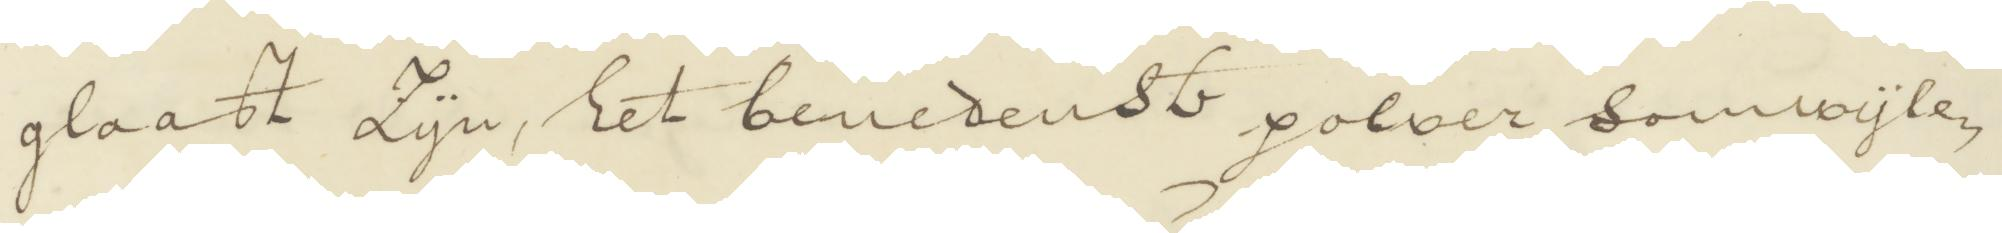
glaast zijn, het benedenste, polver somwijlen
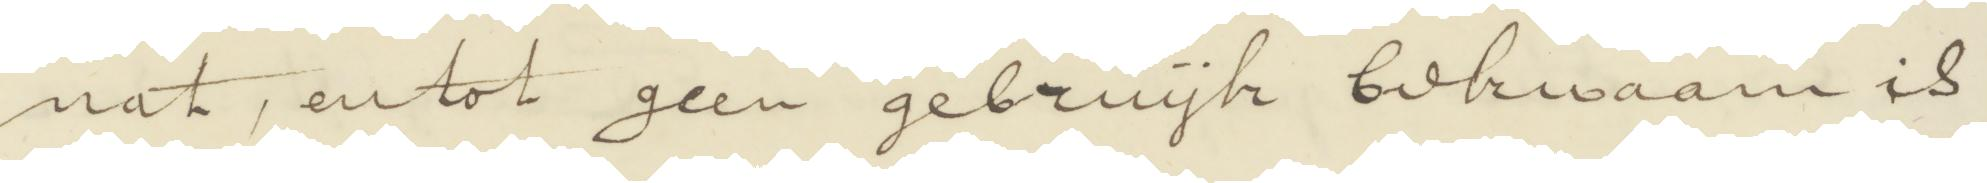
nat, en tot geen gebruijk bekwaam is
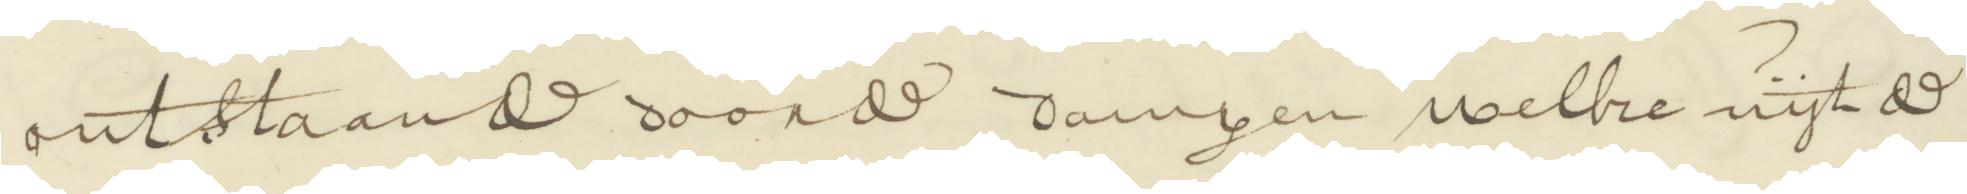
ontstaande door de dampen welke uijt de
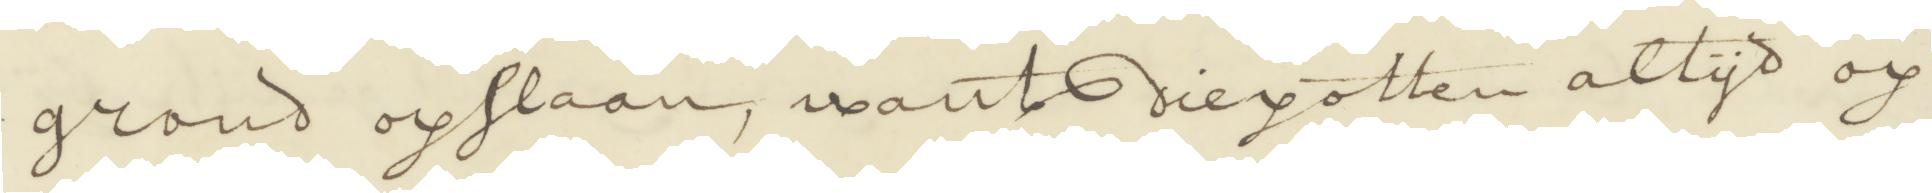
grond opslaan, want die potten altijd op
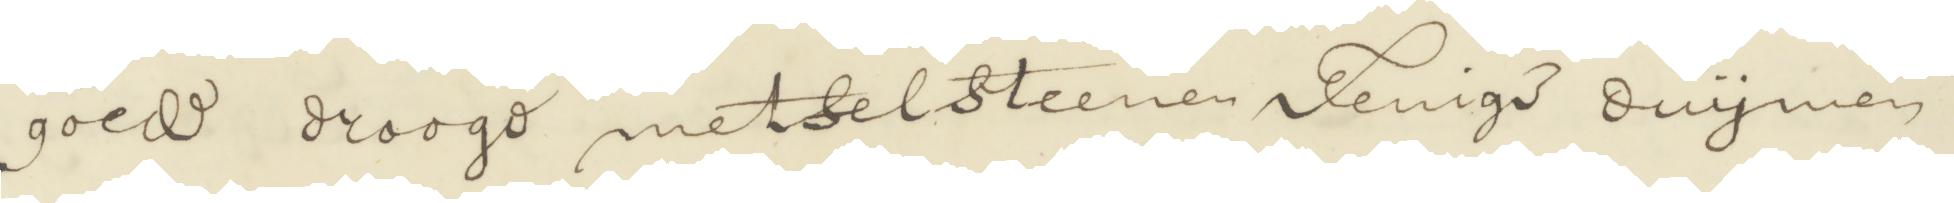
goede drooge metselsteenen Eenige duijmen
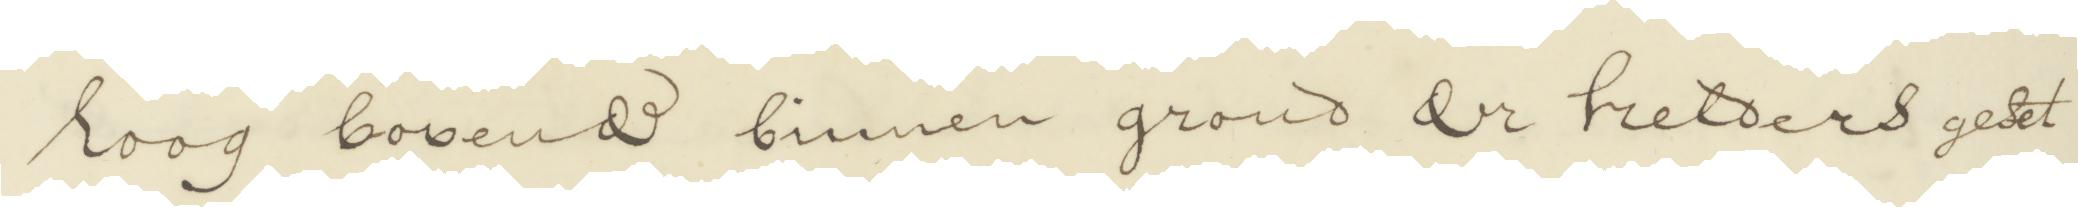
hoog boven de binnen grond der kelders geset
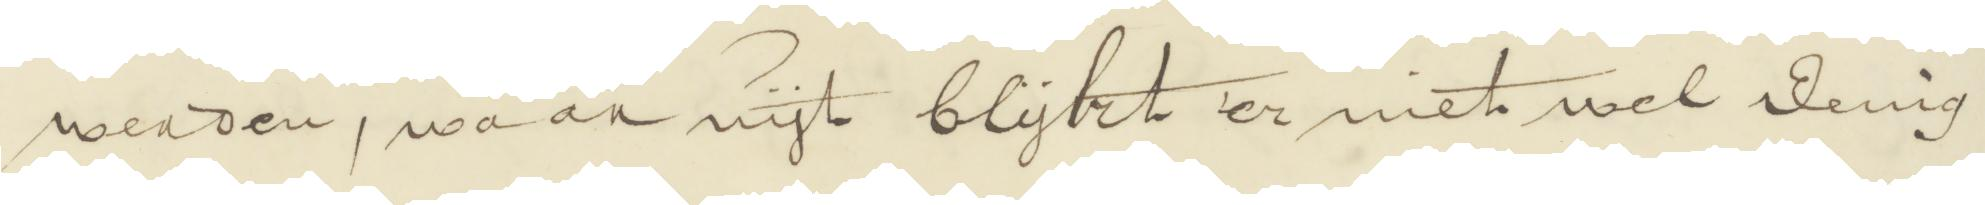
werden, waar uijt blijkt er niet wel Eenig
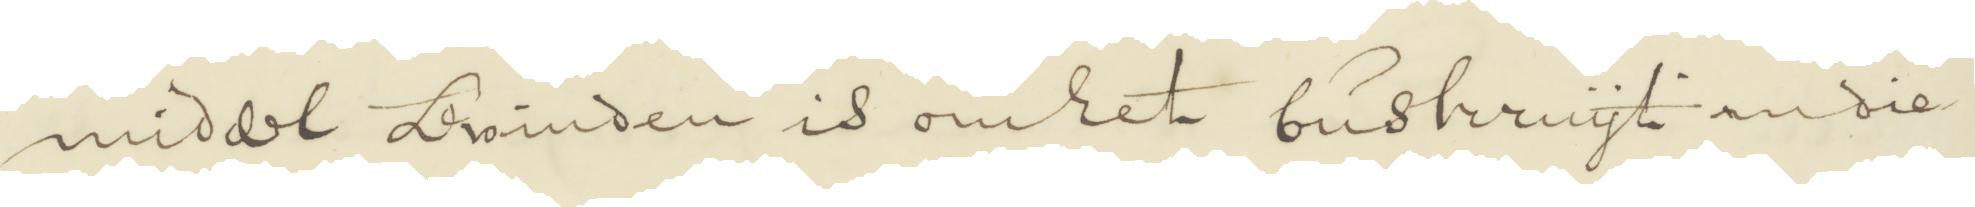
middel te vinden is om het buskruijt in die
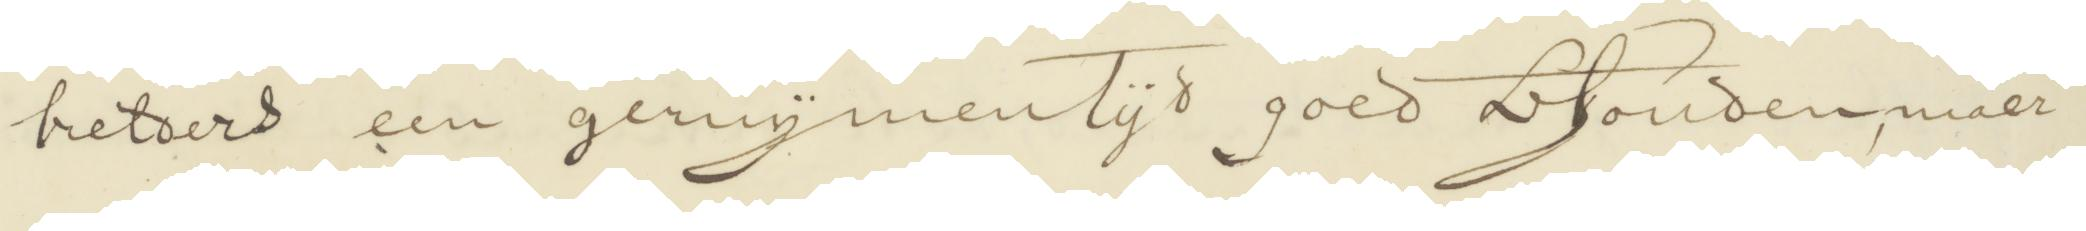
kelders een geruijmen tijd goed tehouden, maer
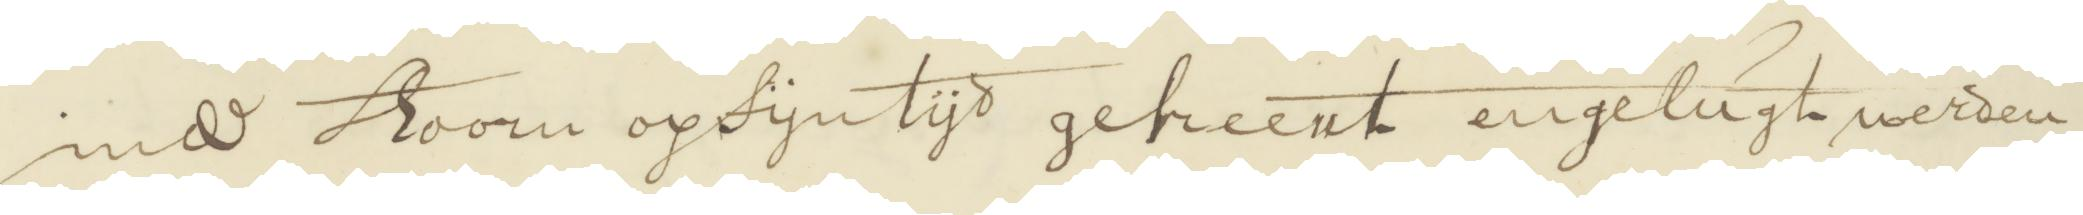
in de thoorn op sijn tijd gekeert en gelugt werden
